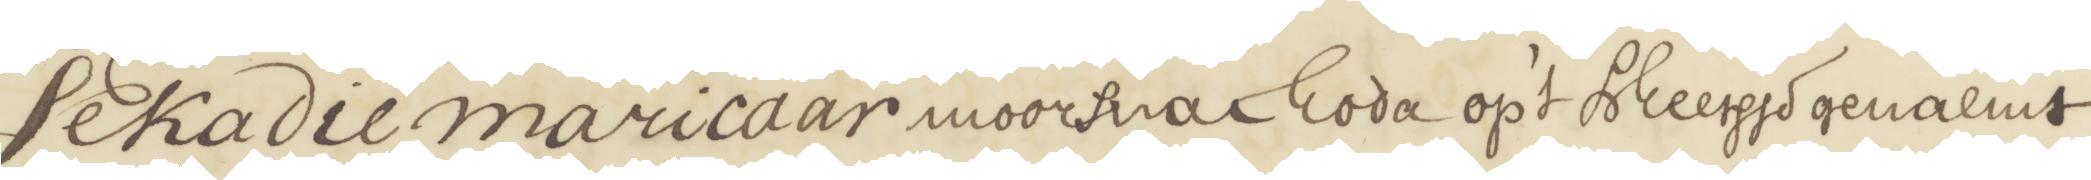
16. _:o Sekadie maricaar moors nachoda op ’t scheepje genaemt
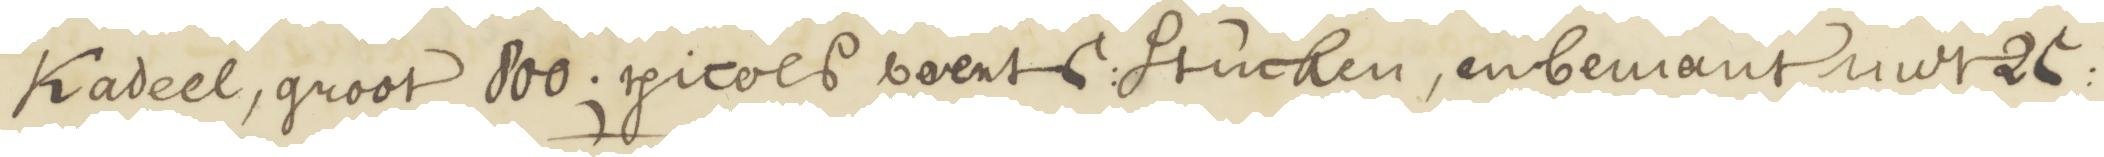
Kadeel, groot 800. picols voert 5: stucken, en bemant met 25:
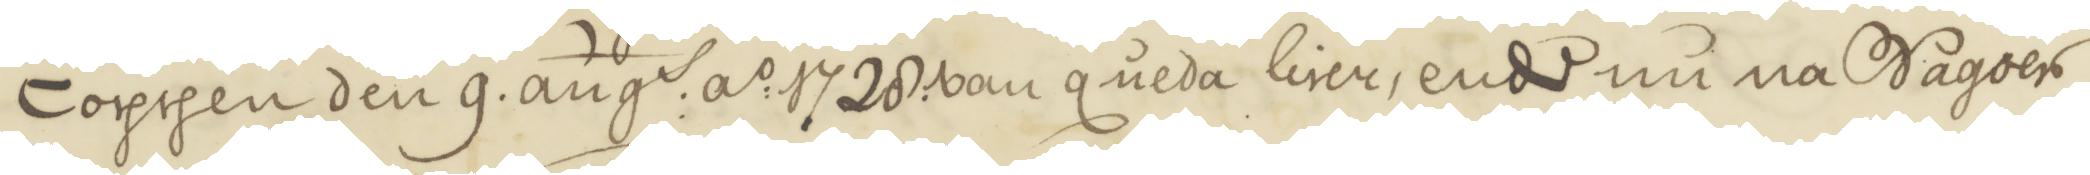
coppen den 9. aug:s a:o 1728: van queda hier, ende nu na Nagoer,
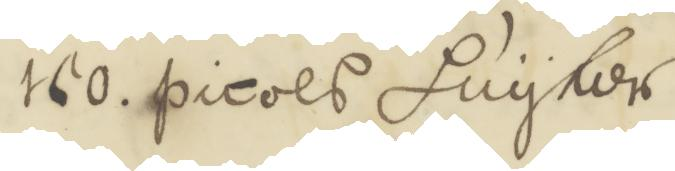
150. picols suijker
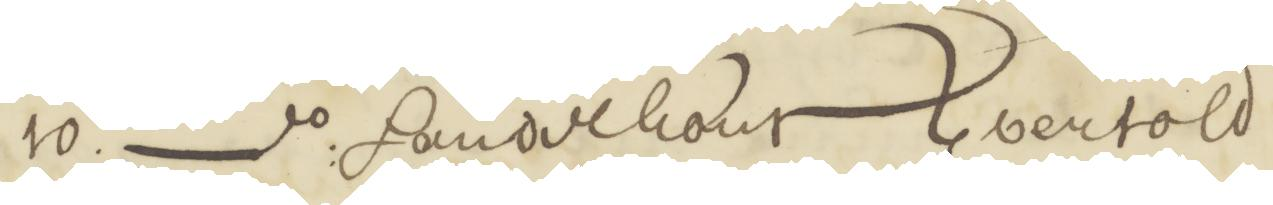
10. _:o sandelhout vertold
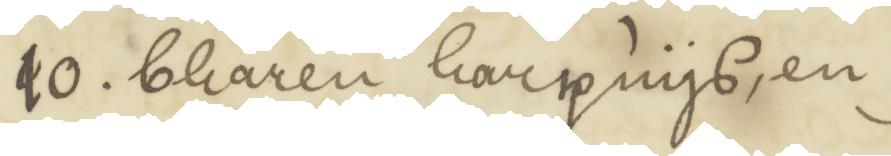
40. bharen harpuijs, en
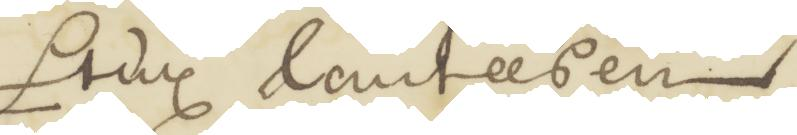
6000 stux lanteesen
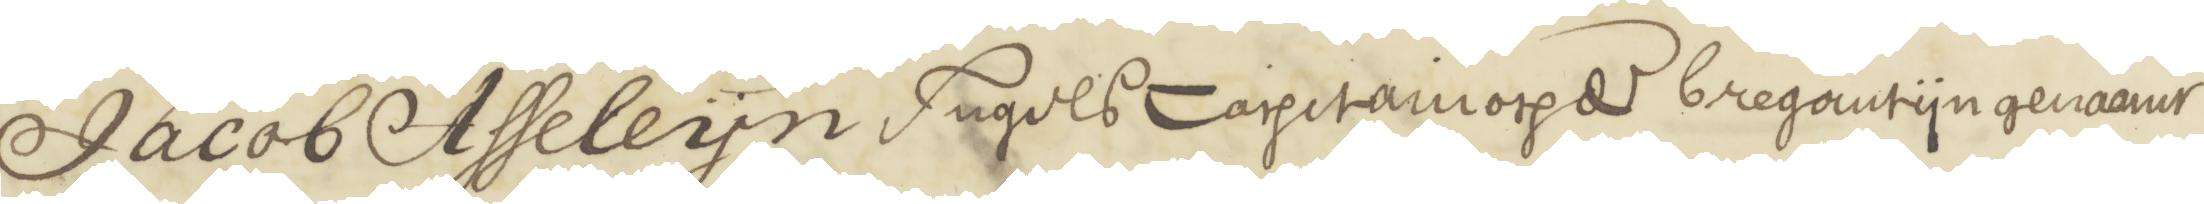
25 _:o Jacob Asseleijn Engels Capitain op de bregantijn genaamt
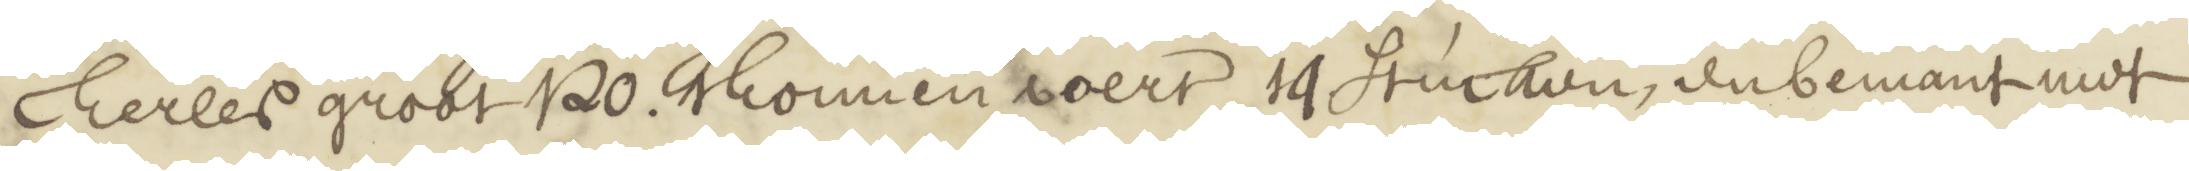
Cherles groot 120. Thonnen voert 14 stucken, en bemant met
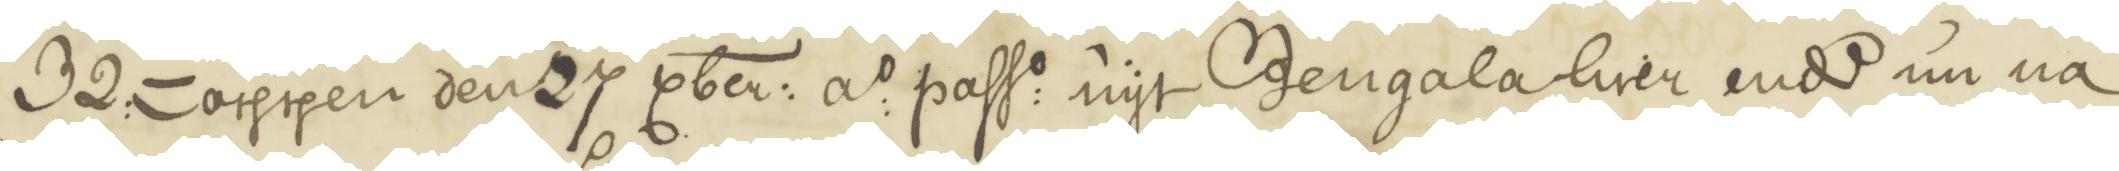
32. coppen den 27 xber: a:o pass:o uijt Bengala hier ende nu na
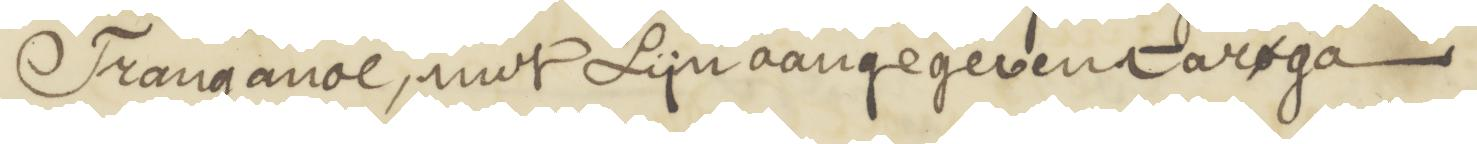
Tranganoe, met sijn aangegeven caroga
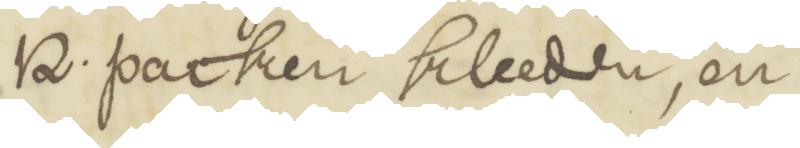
12. packen kleeden, en
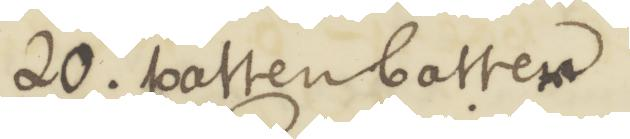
20. potten botter.
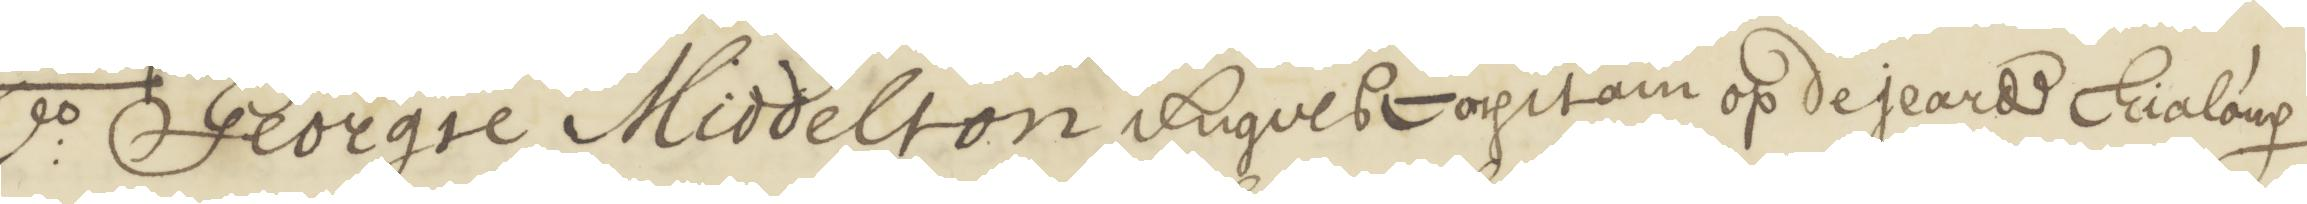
„ _:o Georgie Middelton Engels capitain op de jearde chialoup
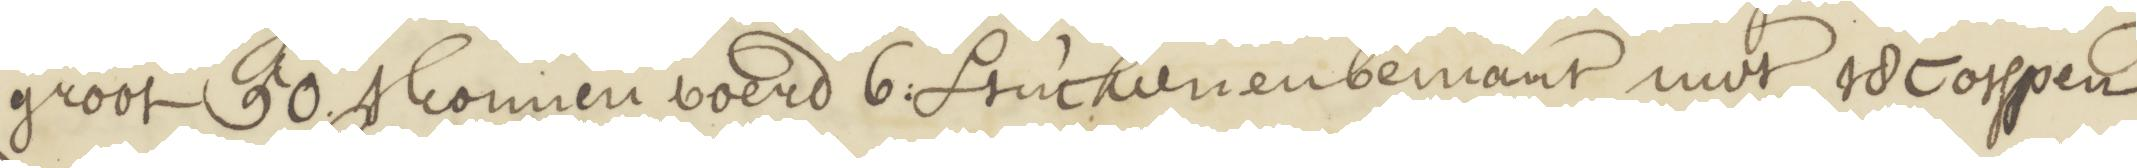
groot 50. thonnen voerd 6: stucken en bemant met 18 Coppen
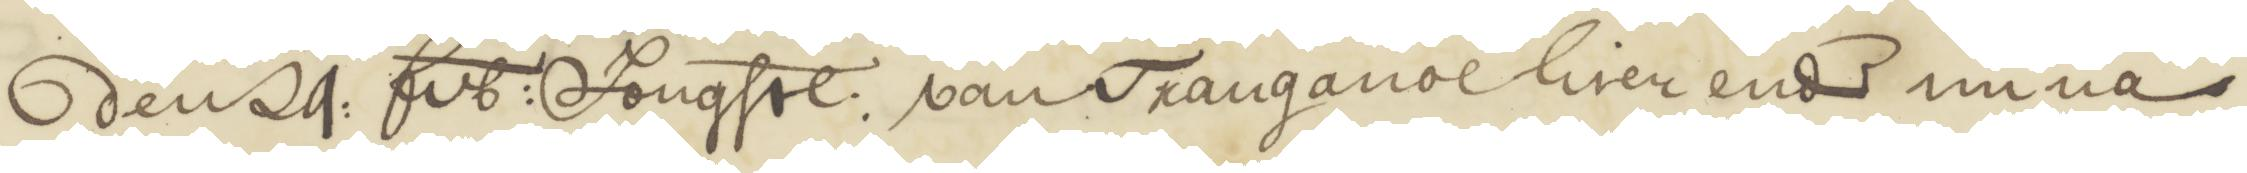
den 24: feb: Jongstl: van Tranganoe hier ende nu na
